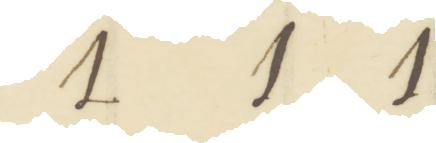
1 1 1
